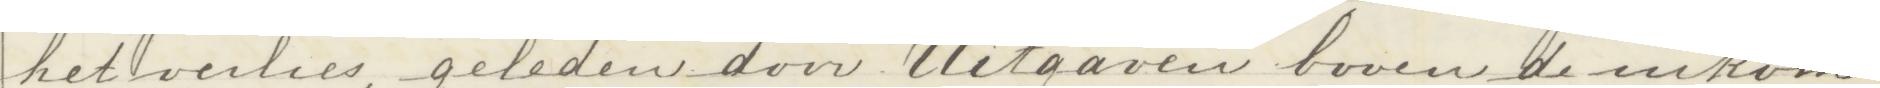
het verlies, geleden door Uitgaven boven de inkom
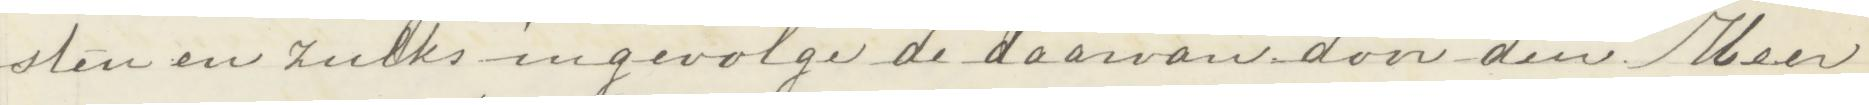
sten en zulks ingevolge de daarvan door den Heer
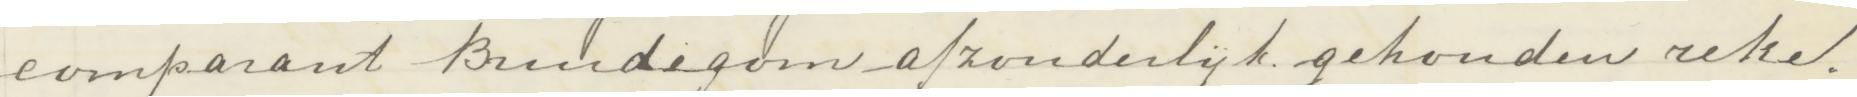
comparant Bruidegom afzonderlijk gehouden reke„
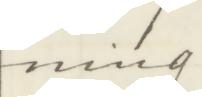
ning
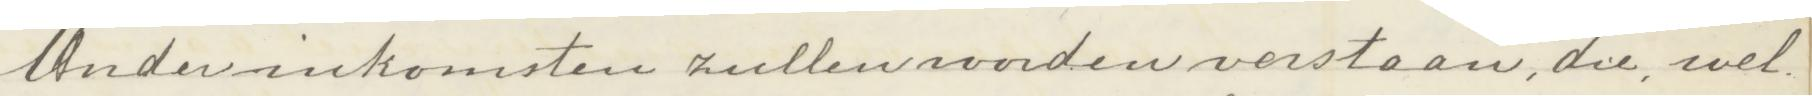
Onder inkomsten zullen worden verstaan, die, wel
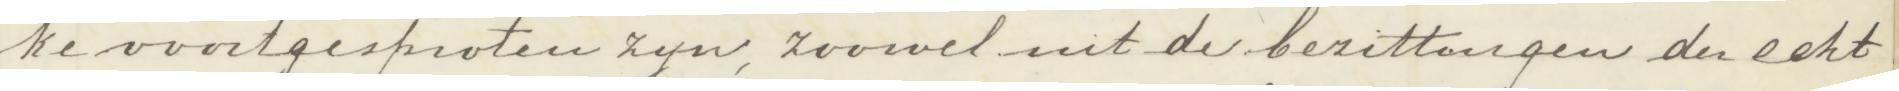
ke voortgesproten zyn, zoowel uit de bezittingen der echt
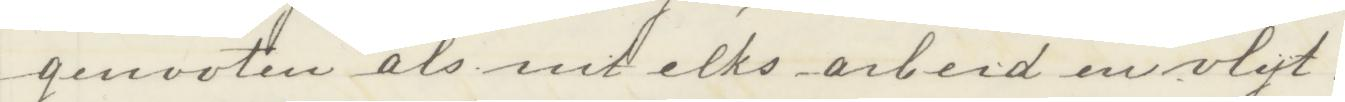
genooten als uit elks arbeid en vlijt
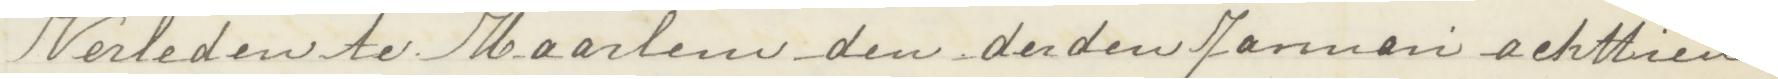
Verleden te Haarlem den derden Januari achttien
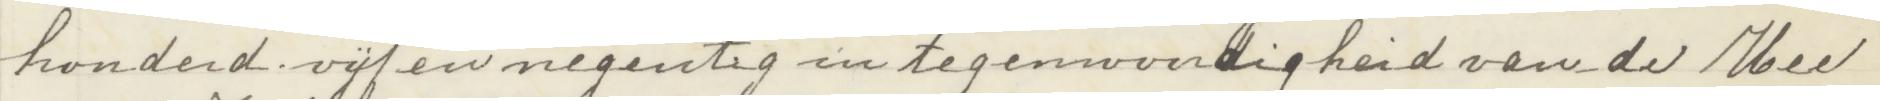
honderd vijf en negentig in tegenwoordigheid van de Hee
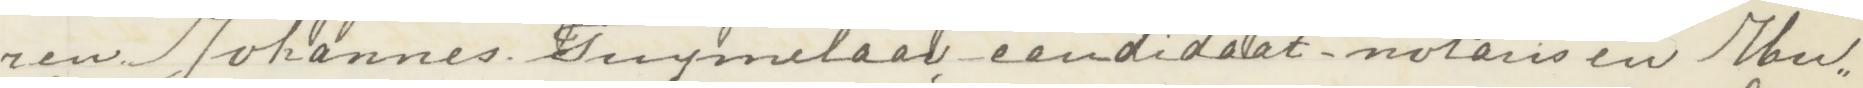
ren Johannes Tuymelaar, candidaat-notaris en Hu„
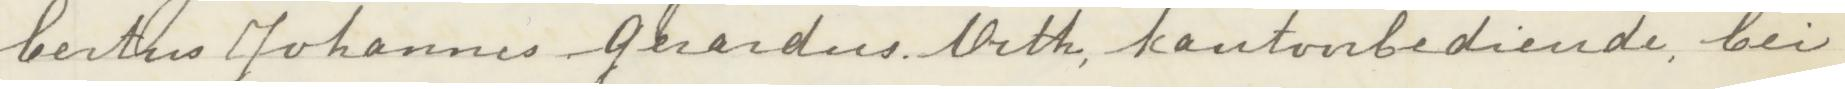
bertus Johannes Gerardus Orth, kantoorbediende, bei
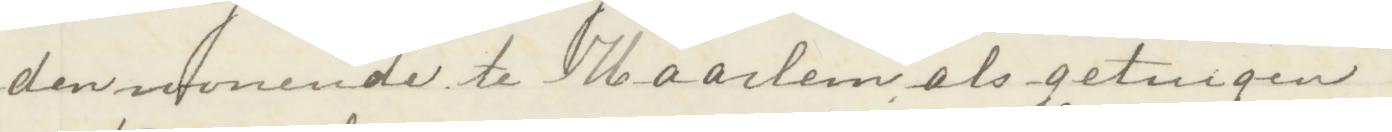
den wonende te Haarlem, als getuigen
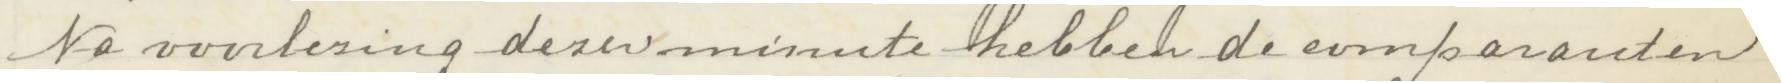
Na voorlezing dezer minute hebben de comparanten
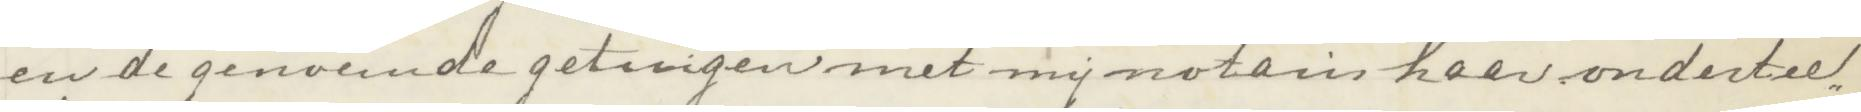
en de genoemde getuigen met mij notaris haer ondertee„
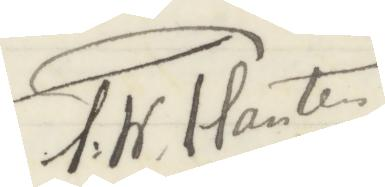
F:W Planten
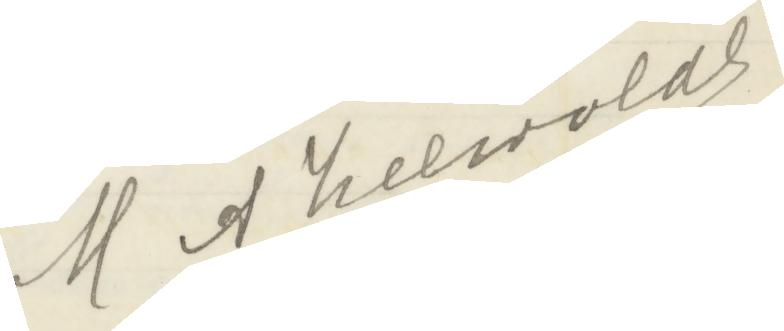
M A Zeewoldt
